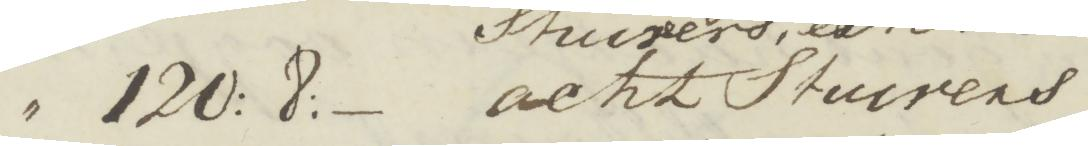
„ 120: 8: — acht Stuivers
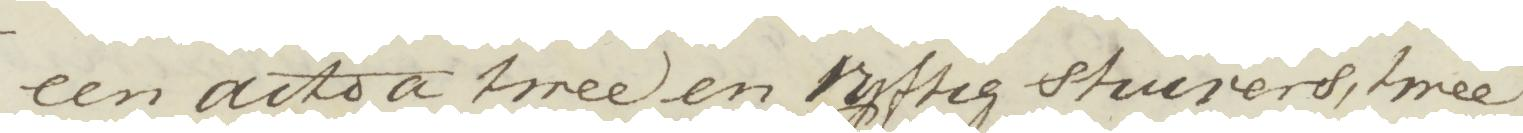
een dito a twee en vyftig stuivers, twee
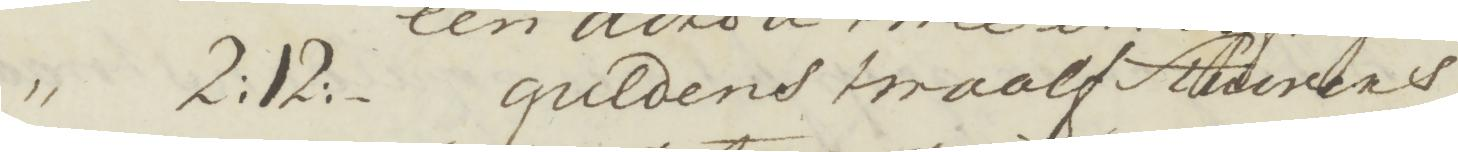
„ 2:12:– guldens twaalf stuivers
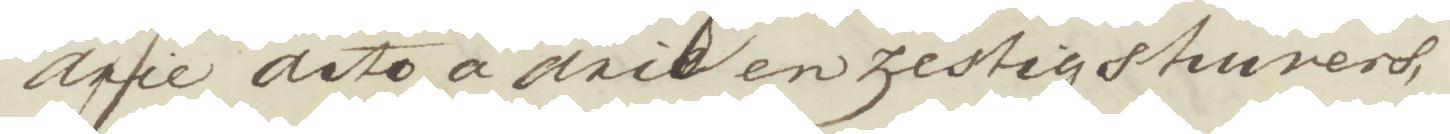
drie dito a drie en zestig stuivers,
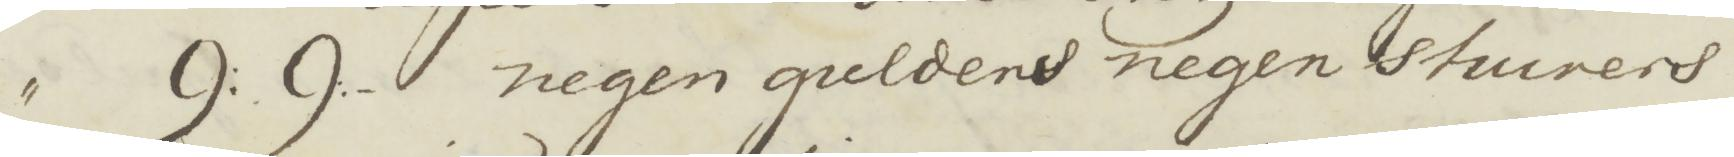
„ 9: 9:– negen guldens negen stuivers
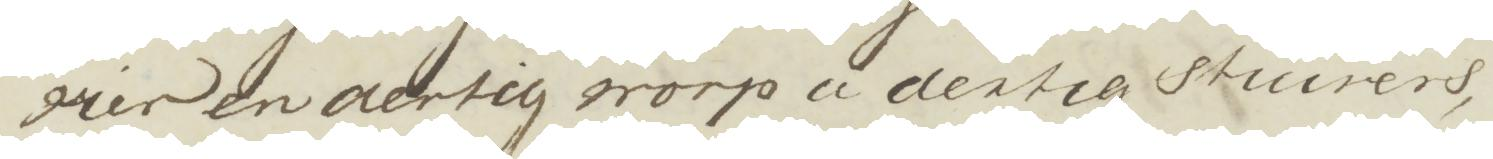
vier en dertig worp a dertig stuivers,
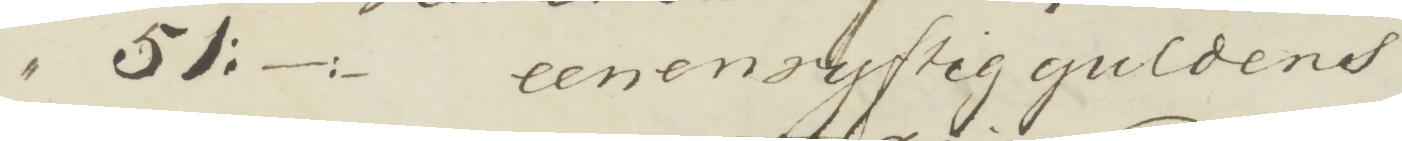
„ 51:—:– een en vyftig guldens
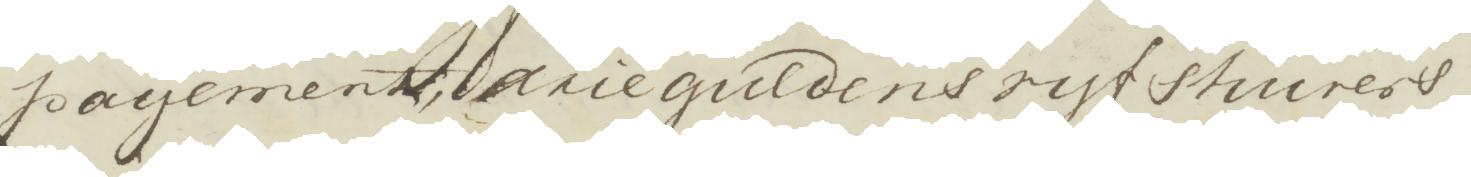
payement, drie guldens vyf stuivers
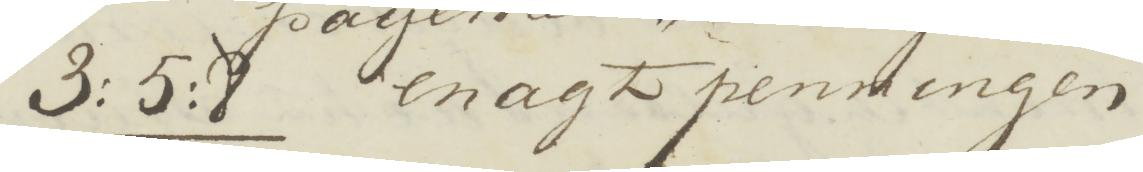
3:5:8 en agt penningen
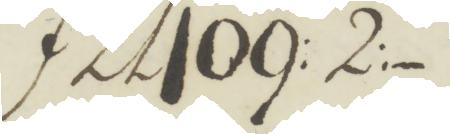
ƒ2409:2:–
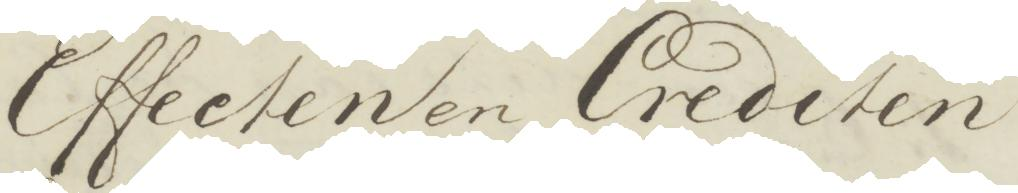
Effecten en Crediten
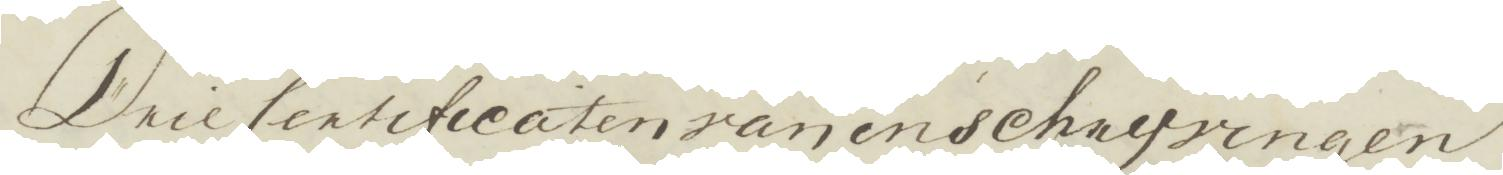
Drie Certificaten van inschryvingen
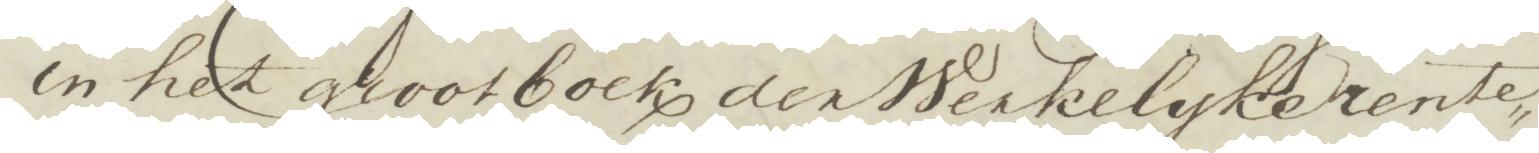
in het grootboek der Werkelyke rente„
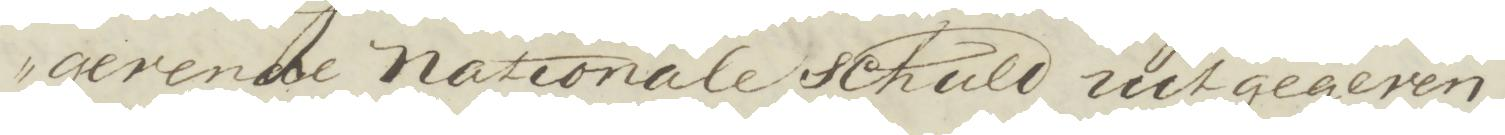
„gevende Nationale schuld uitgegeven
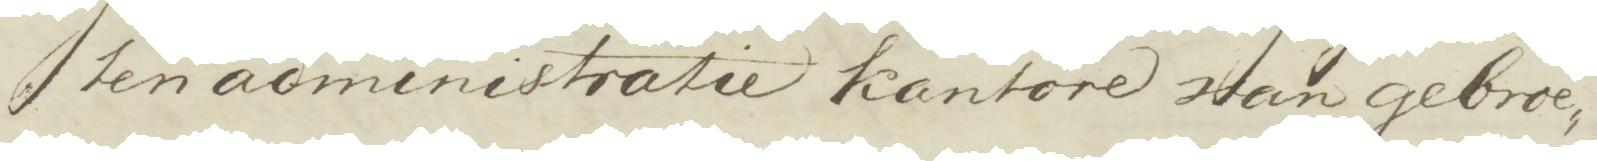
ten administratie kantore van gebroe„
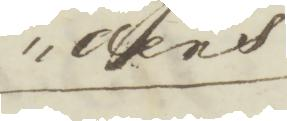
„ders
